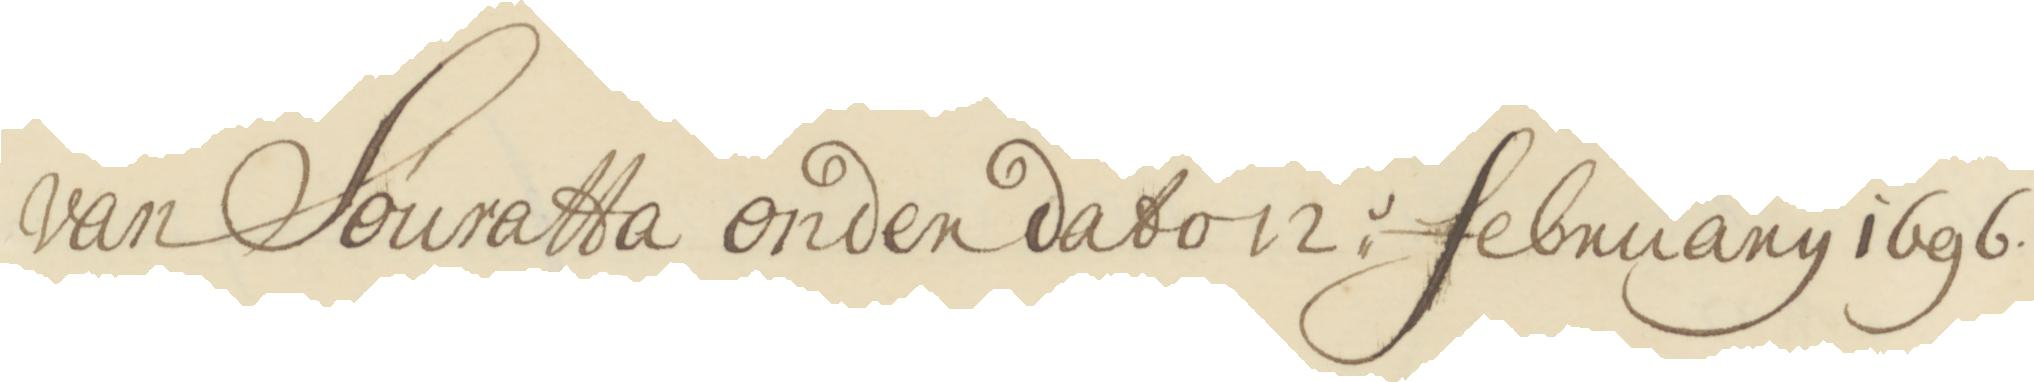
van Souratta onder dato 12:e Februarij 1696.
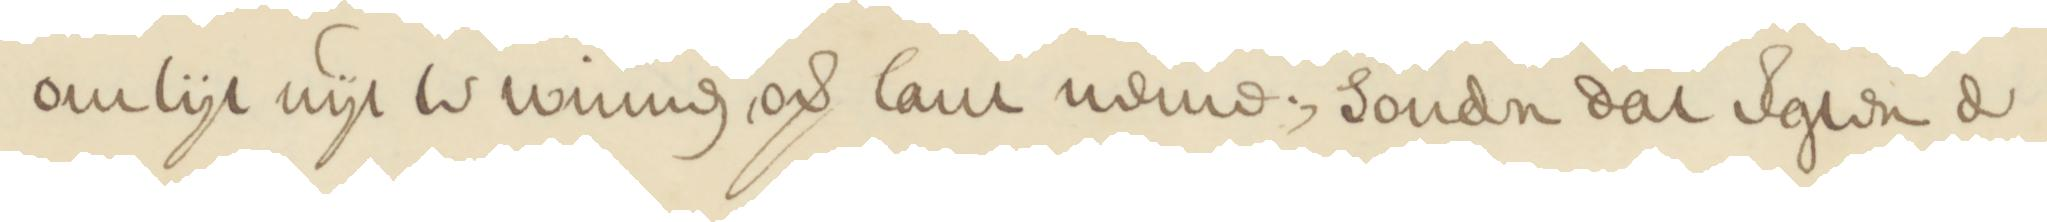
om tijt uijt te winnen, over lant neme; sonder dat egter de
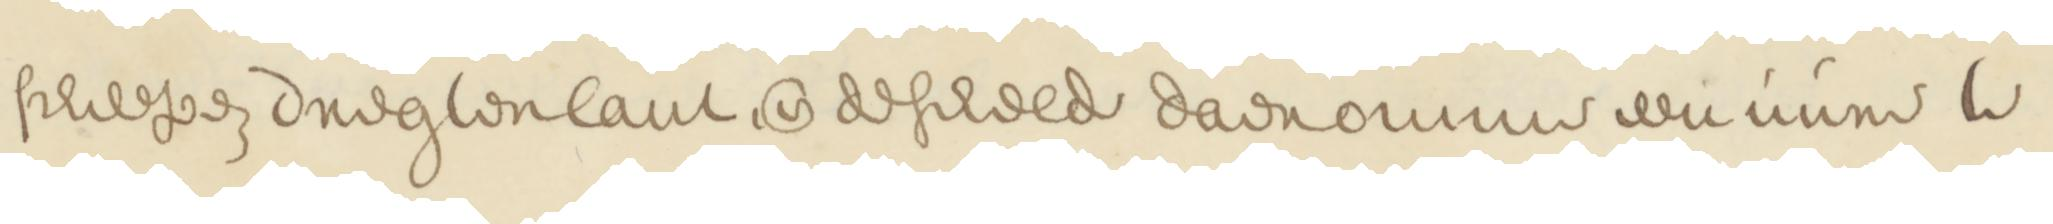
scheepen dregterlant, ende deschelde daeromme een uure te
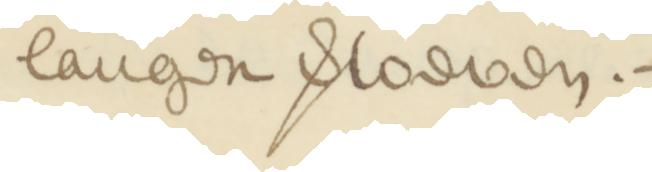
langer vertoeven. —
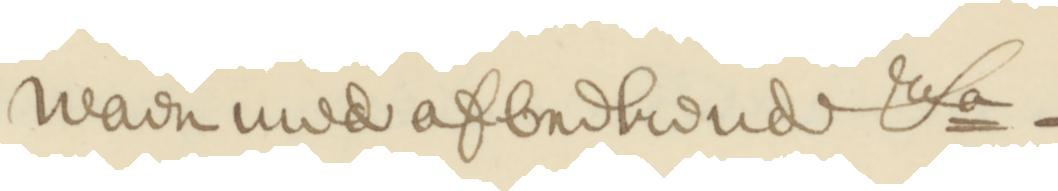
waer mede afbrekende E=ra —
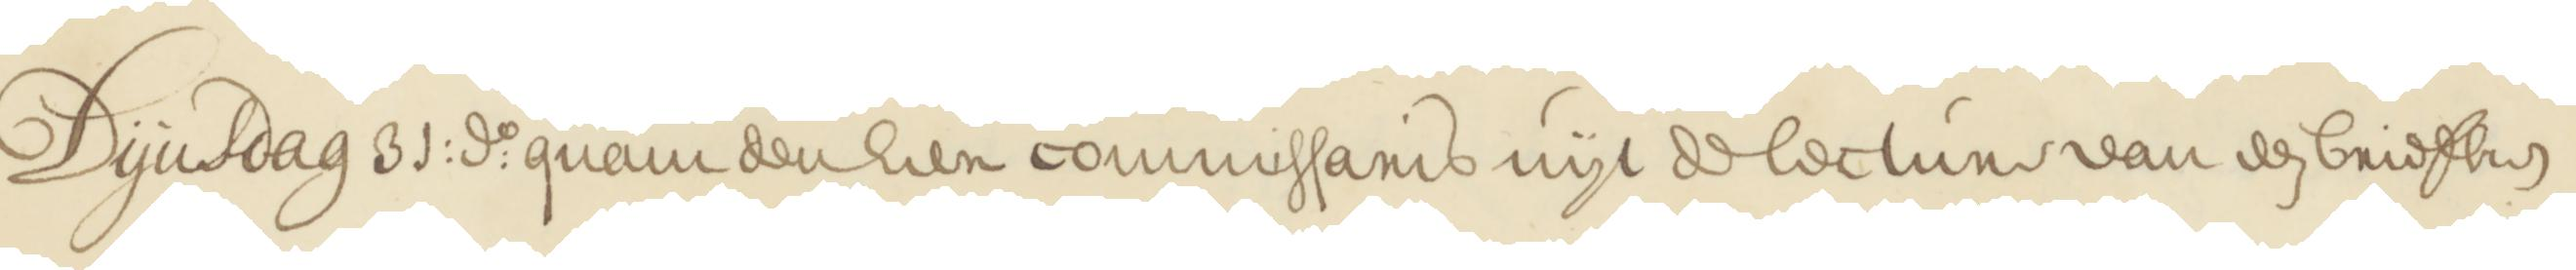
Dijnsdag 31: d:o quam denheer commissaris uijt delecture van een briefken
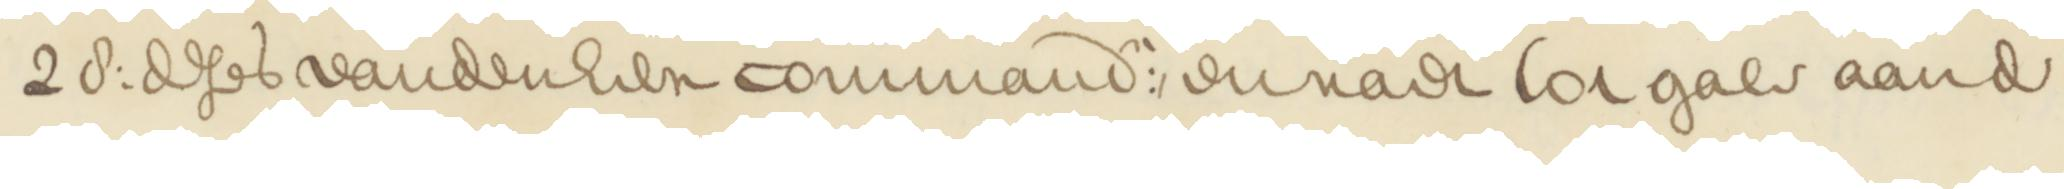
28: deses vandenheer command:r, enraet tot gale aande
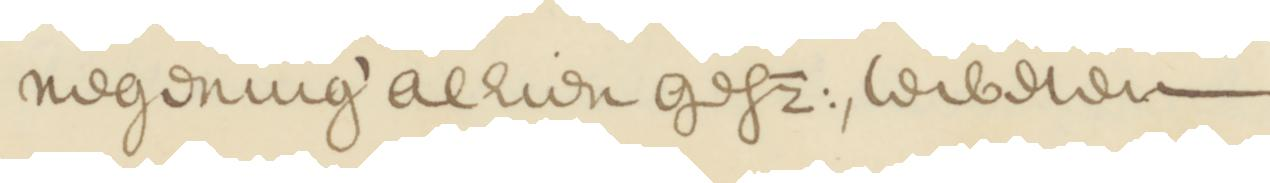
regering' alhier gesz:, teweten
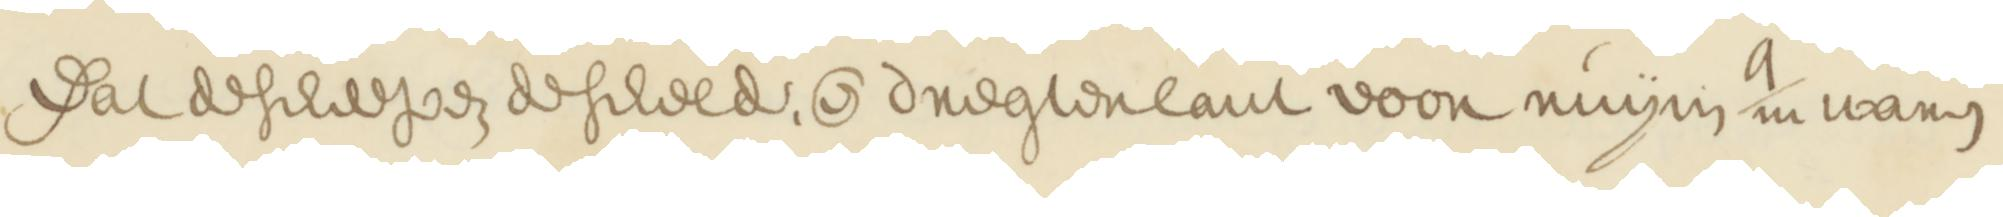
Dat descheepen deschelde, ende dregterlant voor ruijm 4/m waren
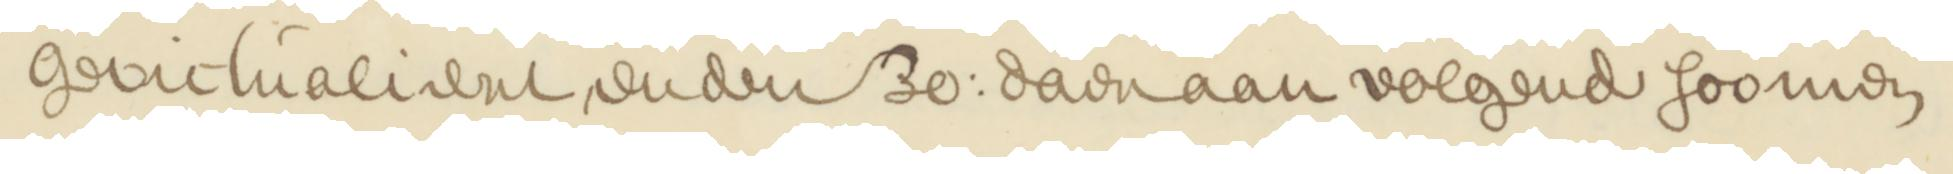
gevictualiert, en den 30: daeraan volgende soo men
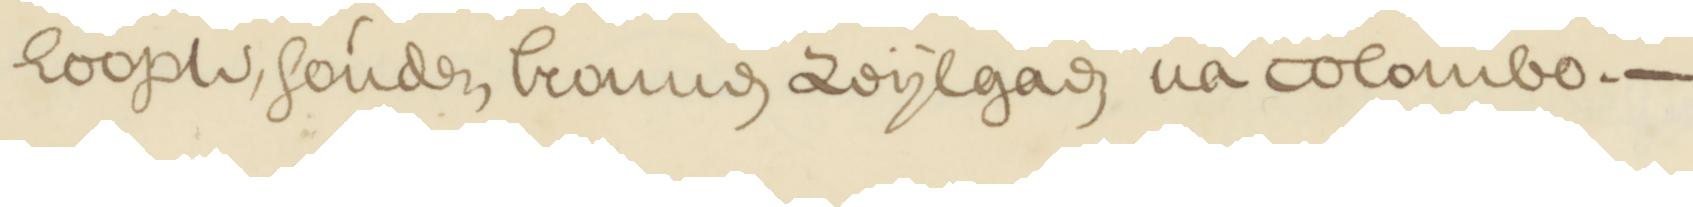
hoopte, souden konnen zeijlgaen na colombo. —
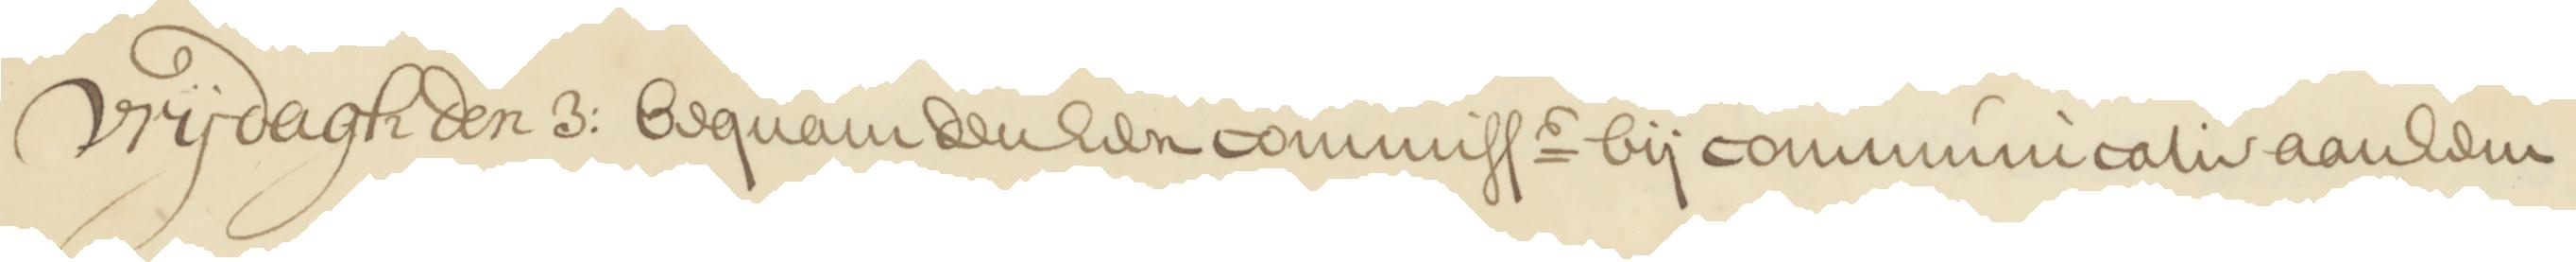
Vrijdagh den 3: bequam denheer commiss=s bij communicatie aanhem
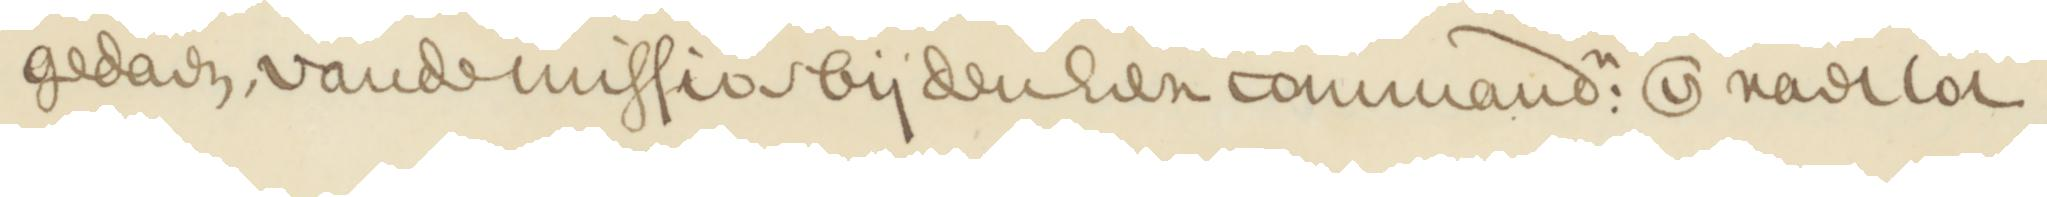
gedaen, vande missive bij denheer command:r ende raet tot
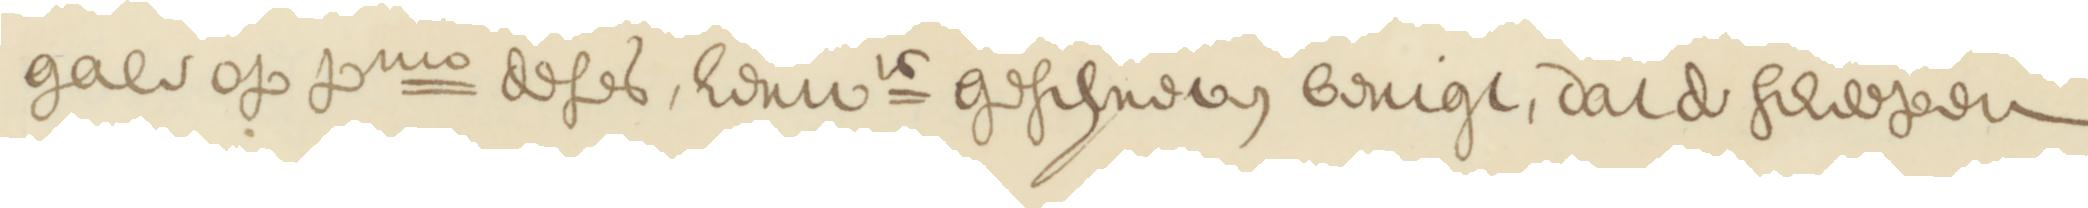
gale op p=mo deses, herw=ts geschreven berigt, dat de scheepen
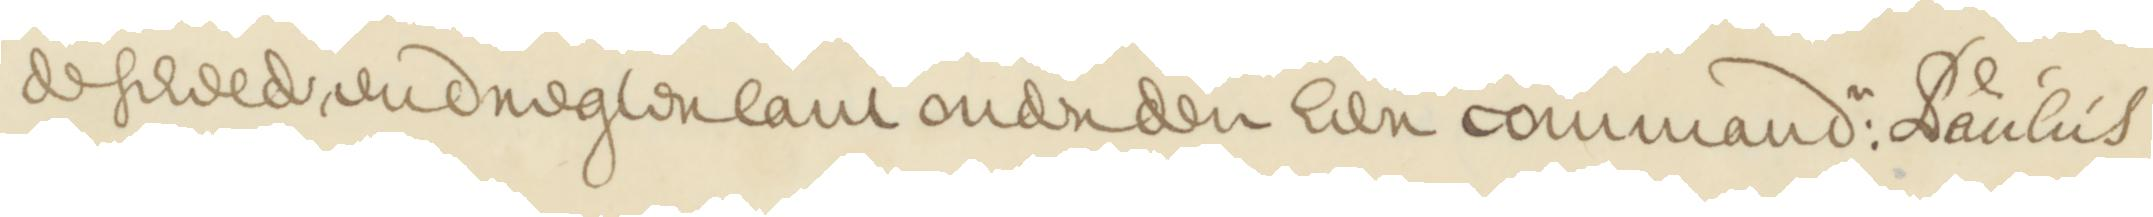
deschelde, endregterlant onderden heer command:r Paulus
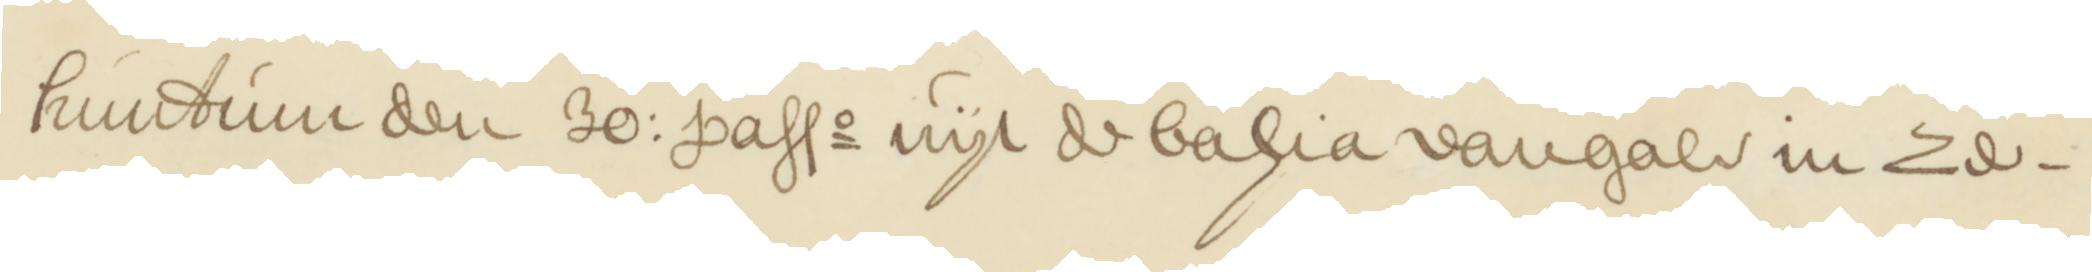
kuntum den 30: pass=o uijt de bahia vangale in ze —
